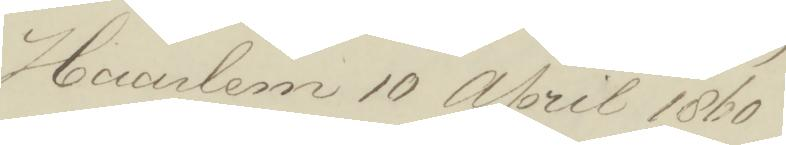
Haarlem 10 April 1860
